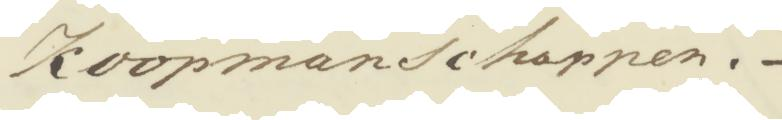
Koopmanschappen. -
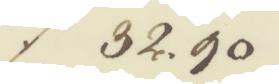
ƒ 32.90
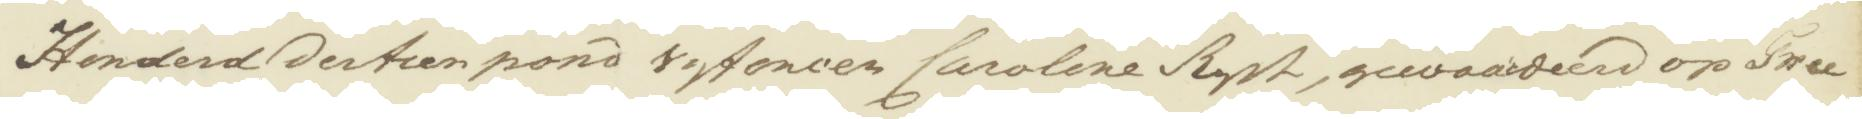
Honderd dertien pond vijfoncen Caroline Ryst, gewaardeerd op Twee
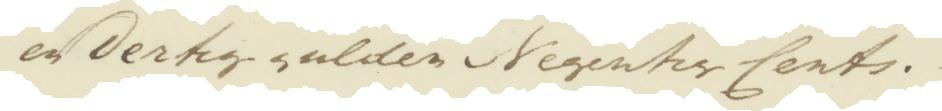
en dertig gulden Negentig Cents.
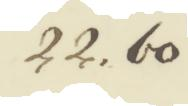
22. 60
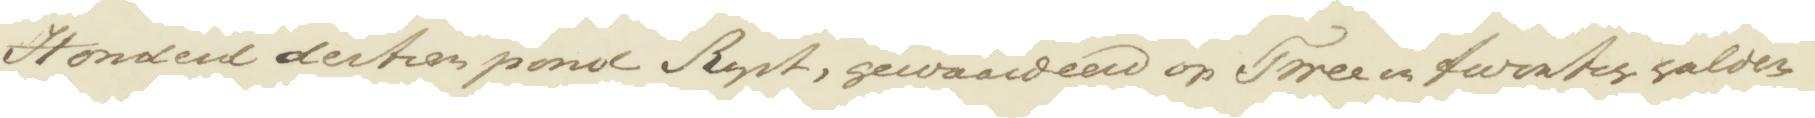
Honderd dertien pond Ryst, gewaardeerd op Twee en twintig gulden
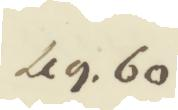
49. 60
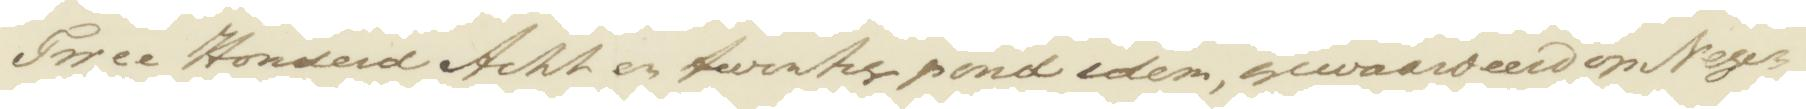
Twee Honderd Acht en twintig pond idem, gewaardeerd op Negen
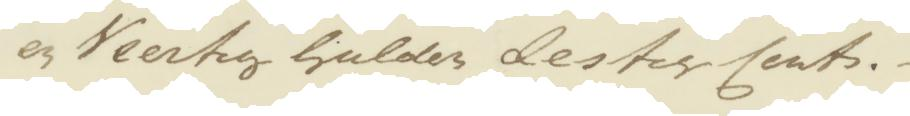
en Veertig Gulden Zestig Cents.
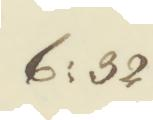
6: 32
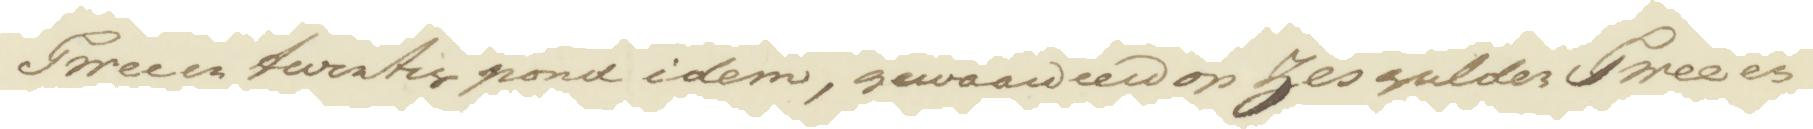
Twee en twintig pond idem, gewaardeerd op zes gulden Twee en
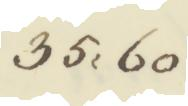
35: 60
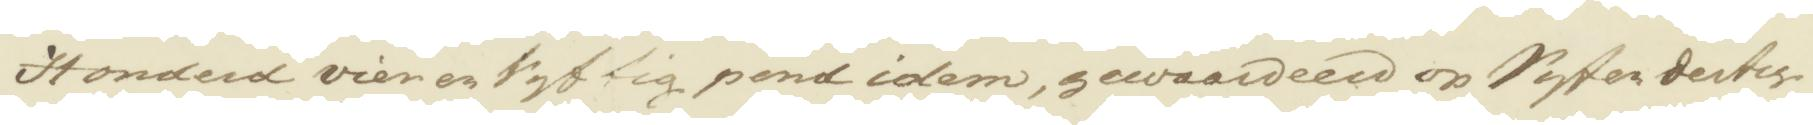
Honderd vier en Vyftig pond idem, gewaardeerd op Vyfen dertig
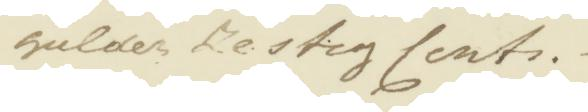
gulden zestig Cents.
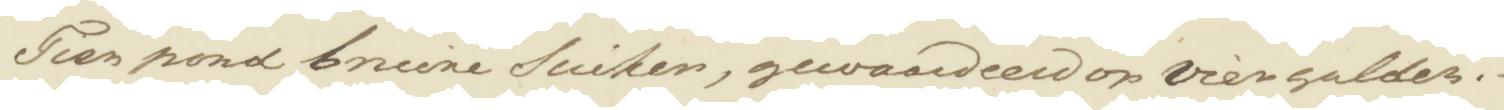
Tien pond bruine suiker, gewaardeerd op vier gulden.
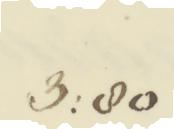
3: 80
